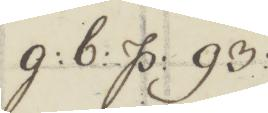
g: b: p: 93:
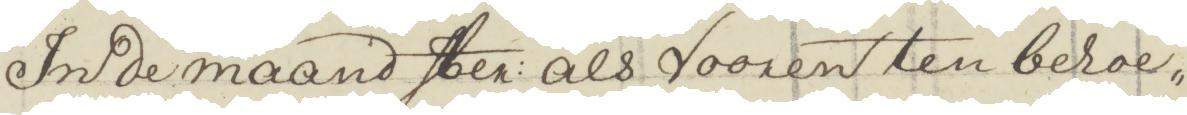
In de maand Jber: als vooren ten behoe„
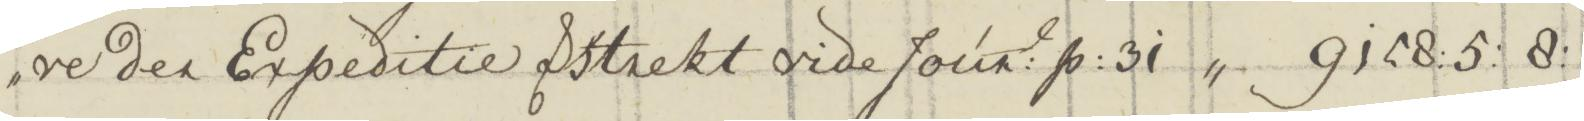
„ve der Expeditie verstrekt vide jour:l p: 31 „ 9158: 5: 8:
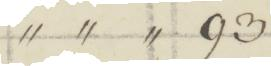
„ „ „ 93
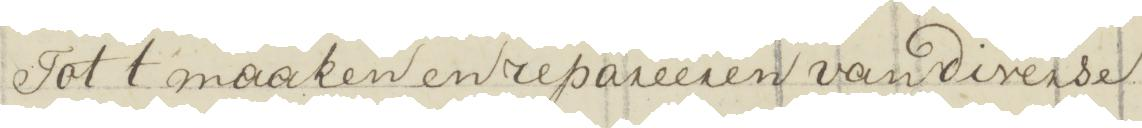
Tot ’t maaken en repareeren van diverse
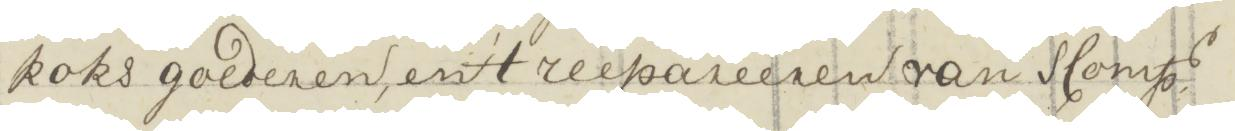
koks goederen, en ’t reepareeren van ’sComp:s
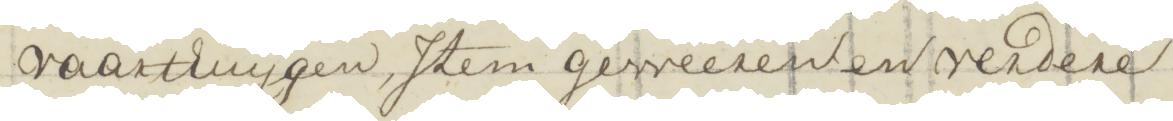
vaarthuijgen, Jtem geweeren en verdere
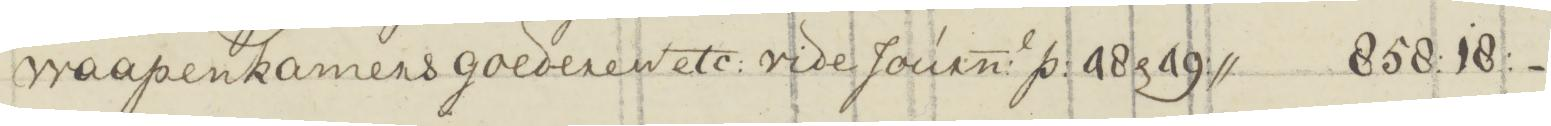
waapenkamers goederen etc: vide Journ:l p: 48 en 49:„ 858:18:—
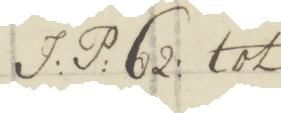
I: P: 62: tot
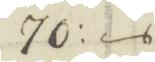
70: ~
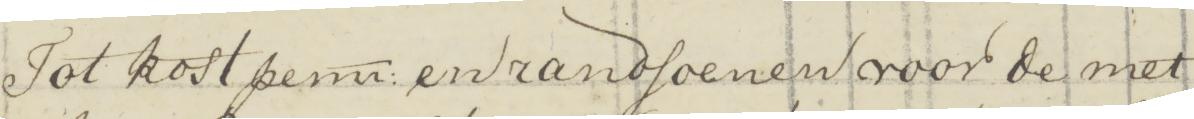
Tot kost penn: en randsoenen voor de met
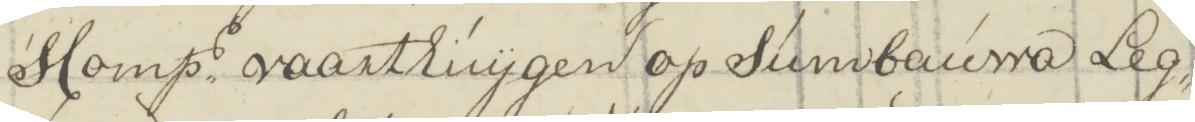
'sComp:s vaarthuijgen op Sumbauwa Leg„
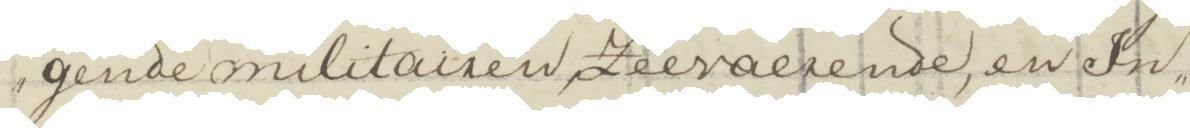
„gende militairen, zeevaerende, en In„
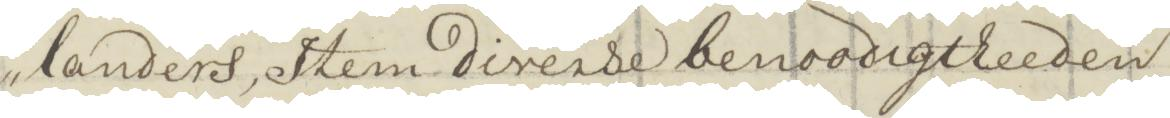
„landers, Item diverse benoodigtheeden
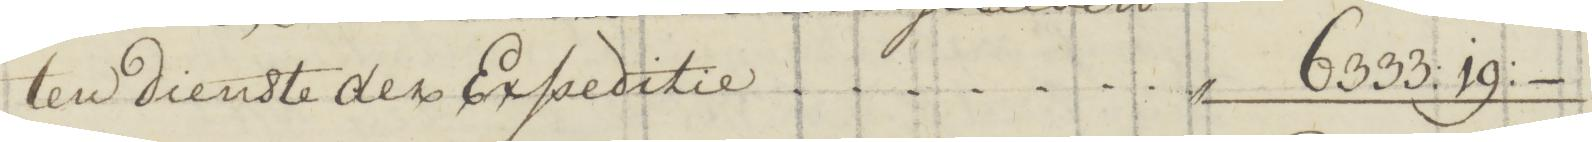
ten dienste der Expeditie . . - - - - . .„ 6333:19:—
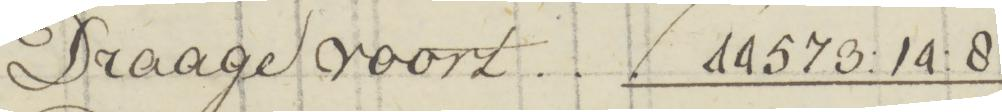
Draage voort . . ƒ 44573:14:8
